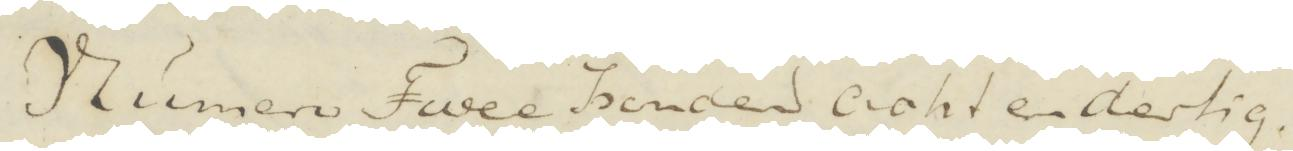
Numero Twee honderd acht en dertig.
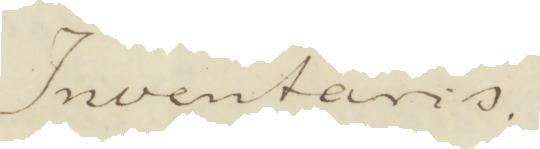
Jnventaris.
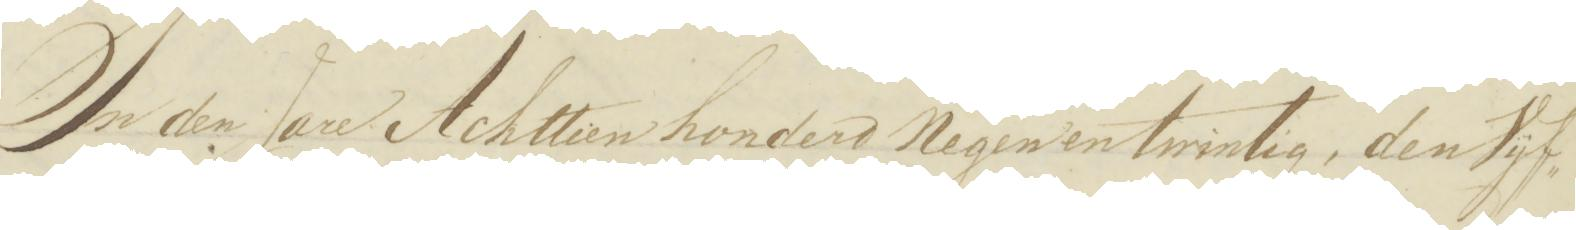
Jn den Jare Achttien honderd Negen en twintig, den Vijf„
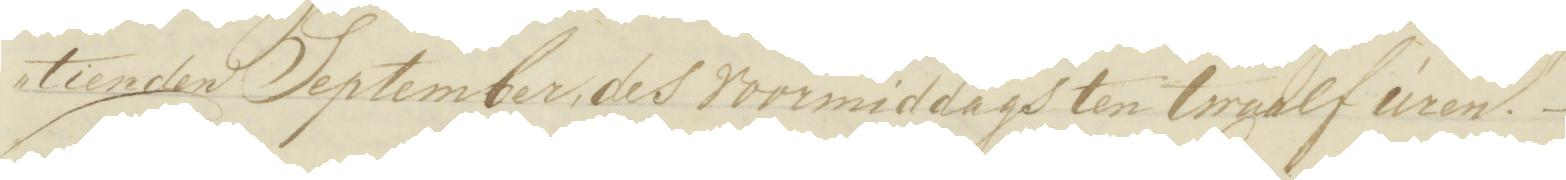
„tienden September, des voormiddags ten twaalf uren.
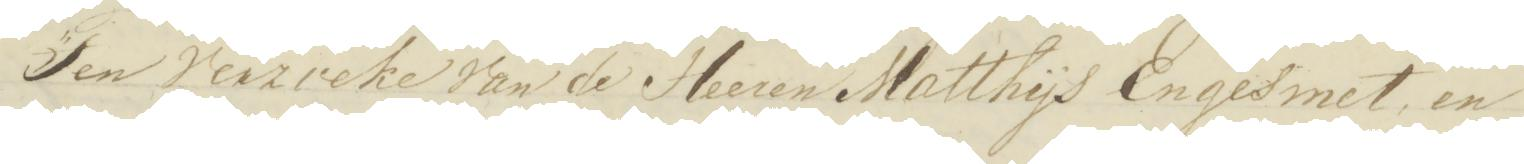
Ten verzoeke van de Heeren Matthijs Engesmet, en
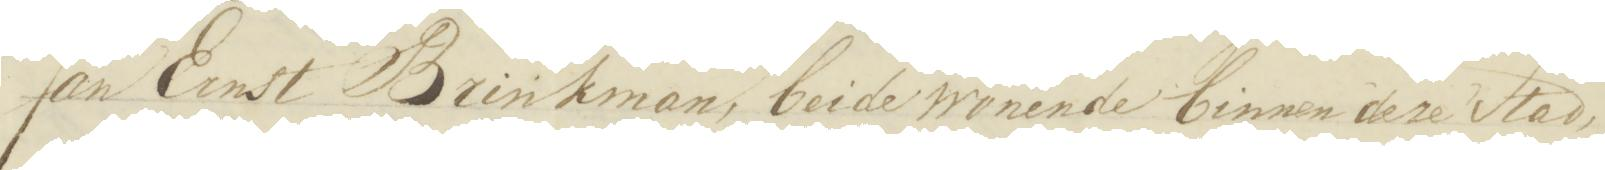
Jan Ernst Brinkman, beide wonende binnen deze Stad,
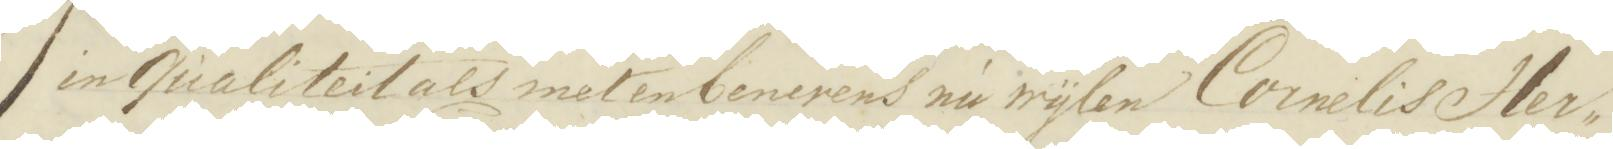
in qualiteit als met en benevens nu wijlen Cornelis Her„
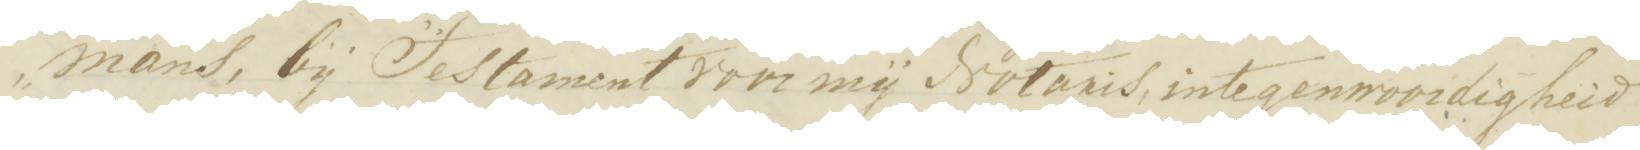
„mans, bij Testament voor mij Notaris, integenwoordigheid
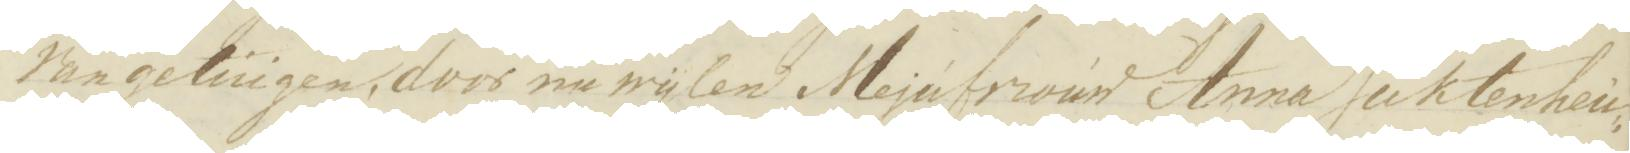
van getuigen, door nu wijlen Mejufvrouw Anna Juktenheu„
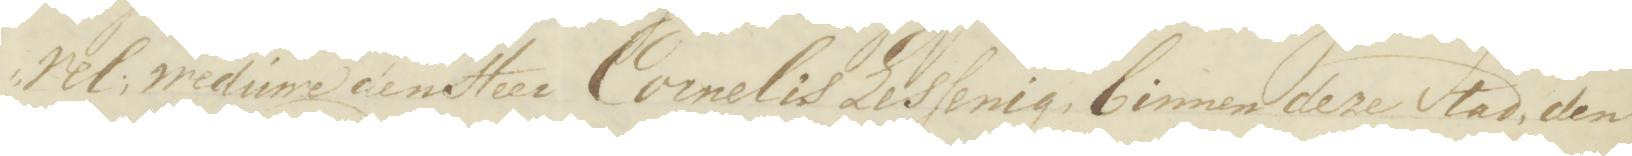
„vel, weduwe den Heer Cornelis Lessenig, binnen deze stad, den
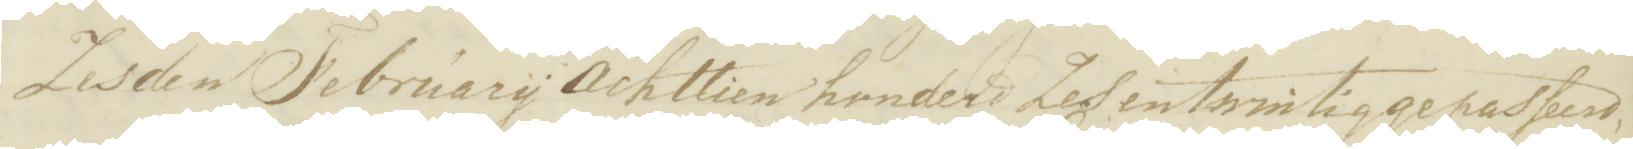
Zesden Februarij Achttien honderd Zes en twintig gepasseerd,
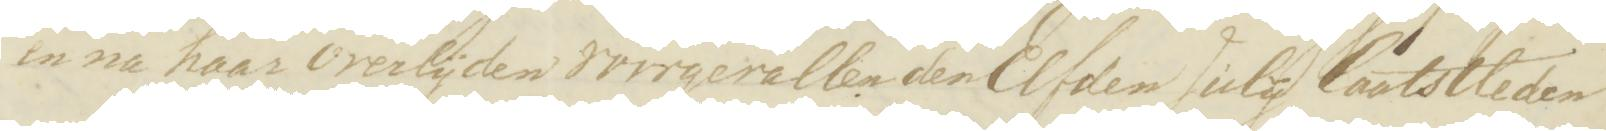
en na haar overlijden voorgevallen den Elfden Julij laatstleden
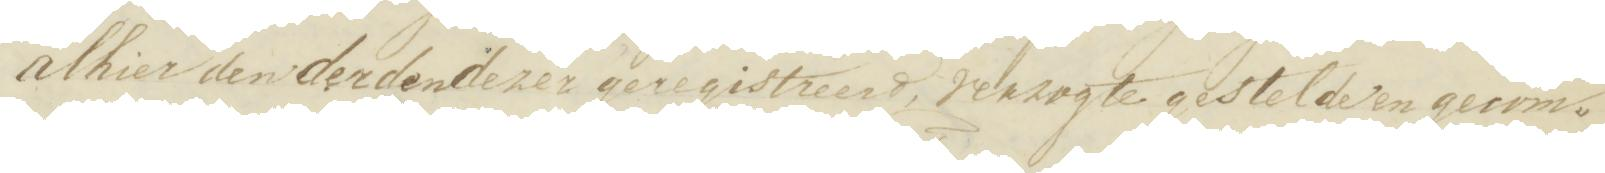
alhier den derden dezer geregistreerd, verzogte gestelde en gecom„
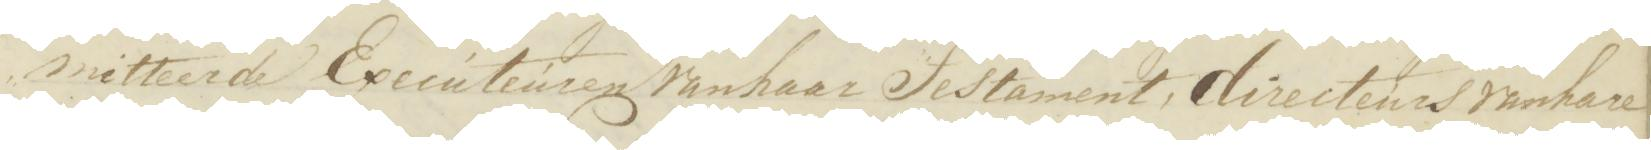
„mitteerde Executeuren van haar Testament, directeurs van hare
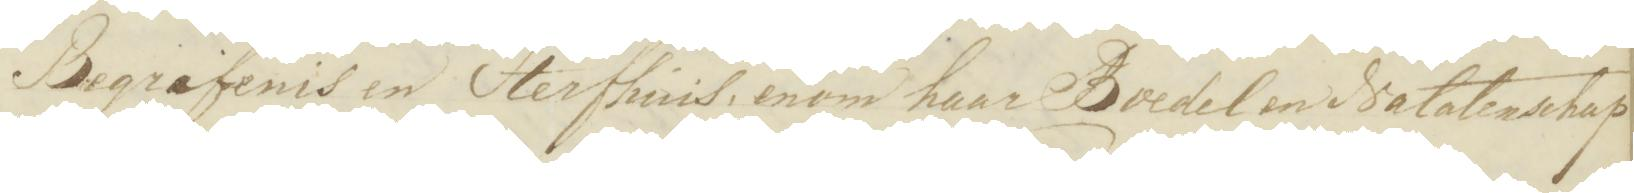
Begrafenis en Sterfhuis, en om haar Boedel en Nalatenschap
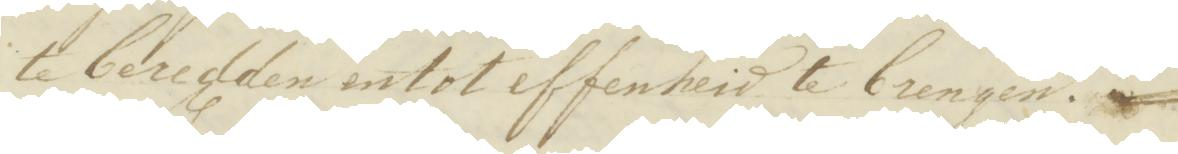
te beredden en tot effenheid te brengen.
